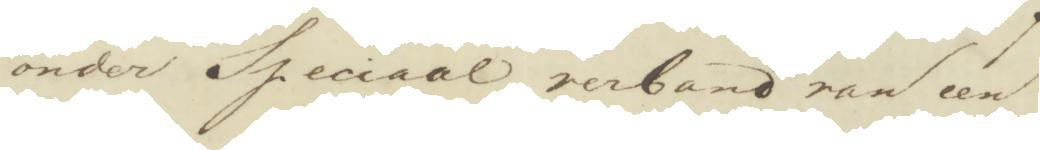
onder speciaal verband van een
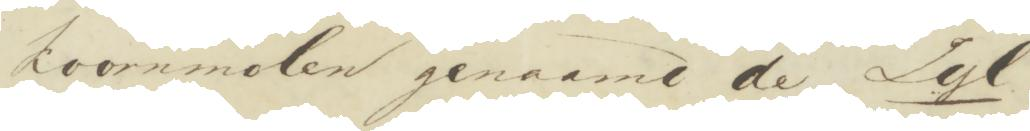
koornmolen genaamd de Zyl
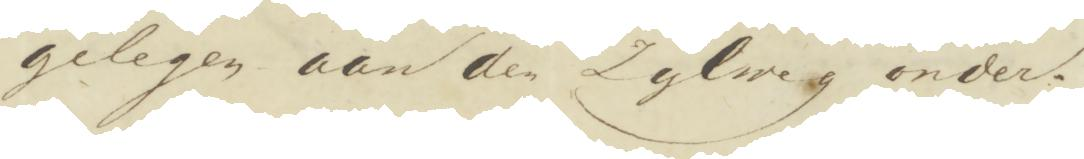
gelegen aan den Zylweg onder„
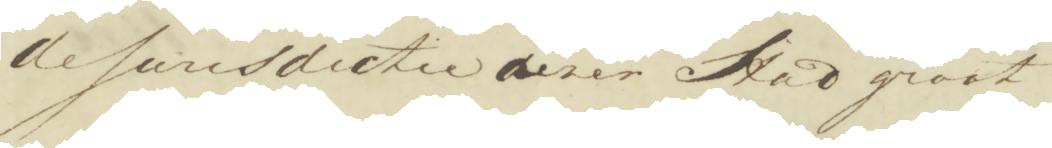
de Jurisdictie dezer Stad groot
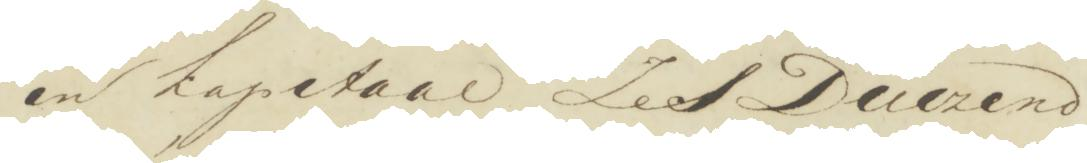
en kapitaal Zes Duizend
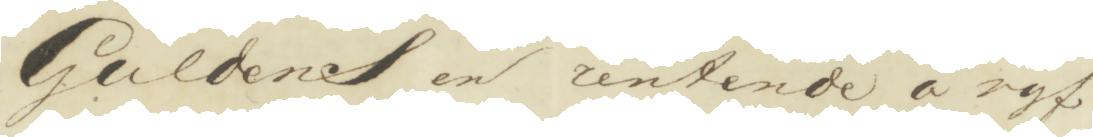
Guldens en rentende a vyf
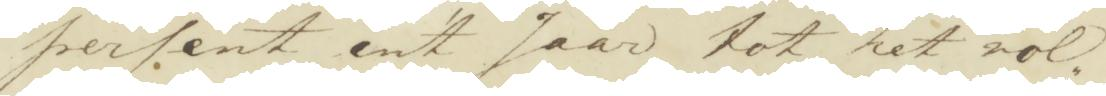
percent in’t Jaar tot het vol„
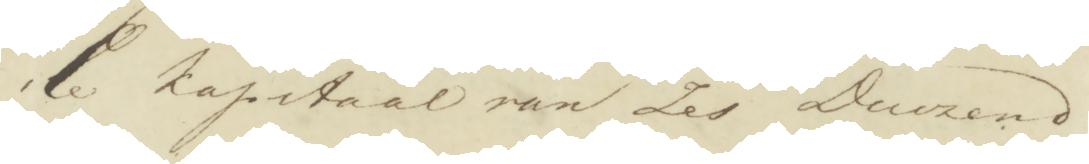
,le kapitaal van zes Duizend
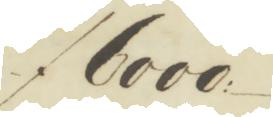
ƒ 6000:_
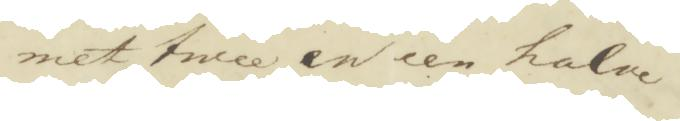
met twee en een halve
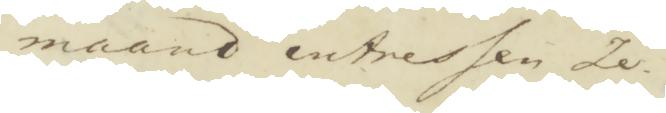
maand intressen ze,
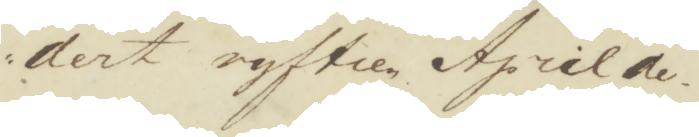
„dert vyftien April de,
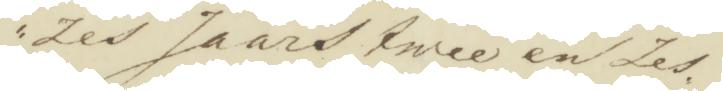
„zes Jaars twee en Zes„
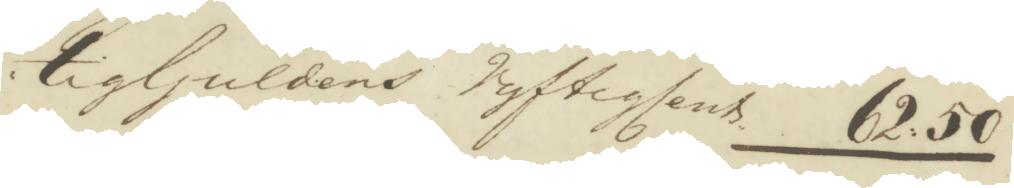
„tig Guldens Vyftig Cents 62:50
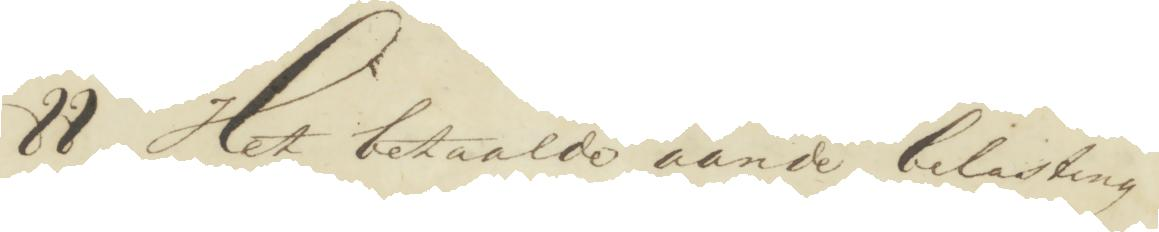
Het betaalde aan de belasting
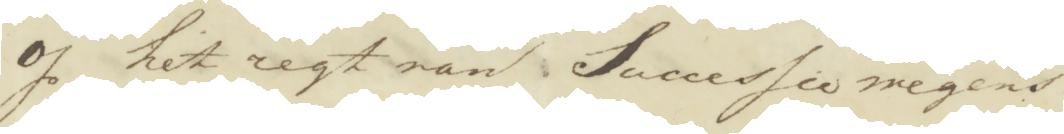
op het regt van Successie wegens
